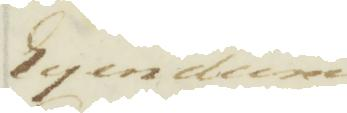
Egendam
